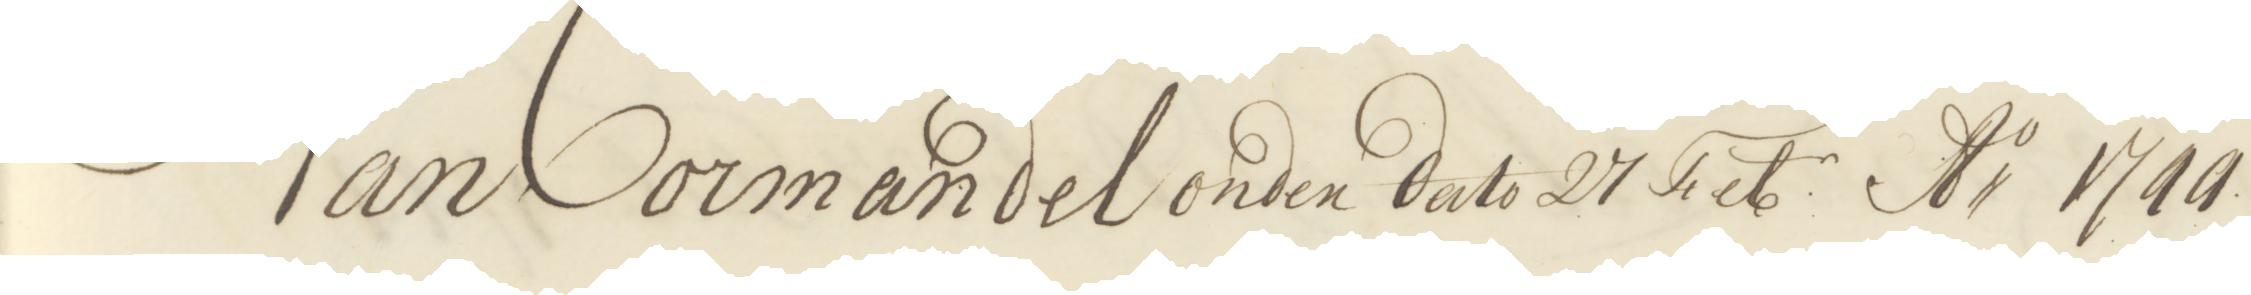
Van Cormandel onder dato 27 Feb:r A„o 1744
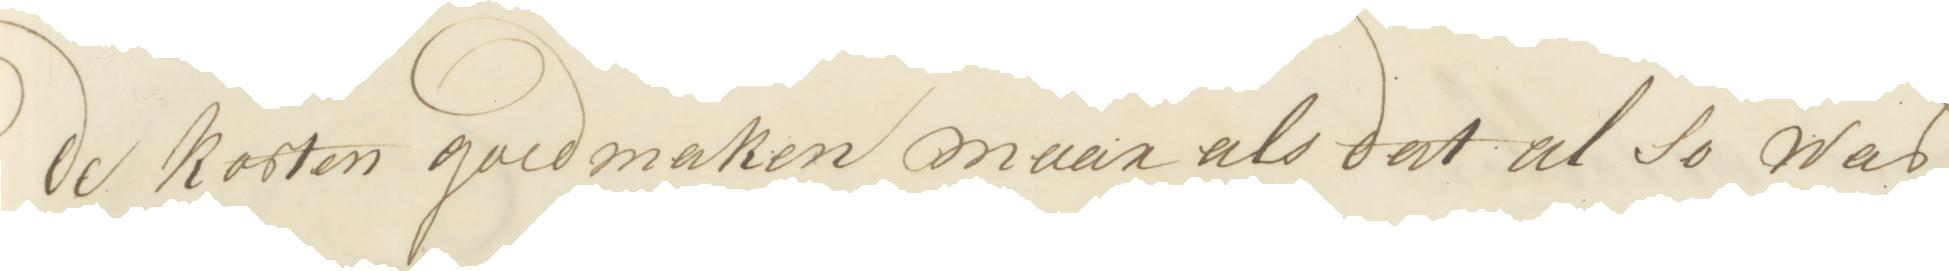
de kosten goedmaken maar als dat al so was
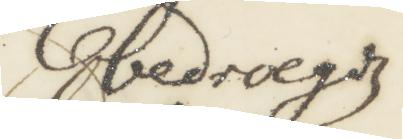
bedroegen
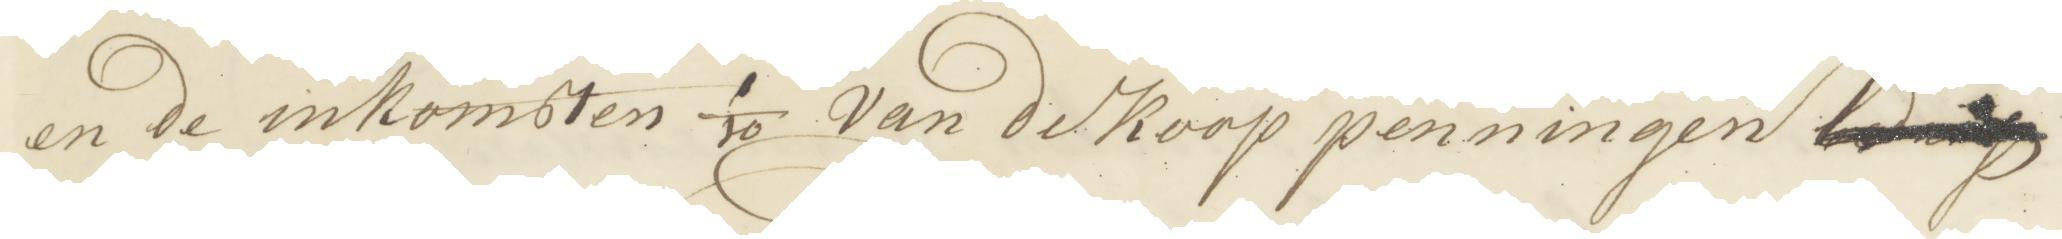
en de inkomsten 1/10 van de koop penningen bedragen
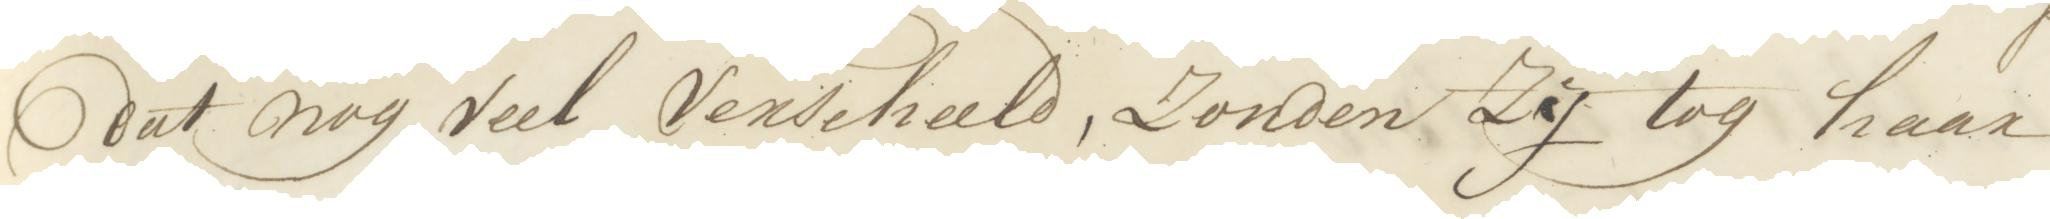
dat nog veel verscheeld, zonden zij tog haar
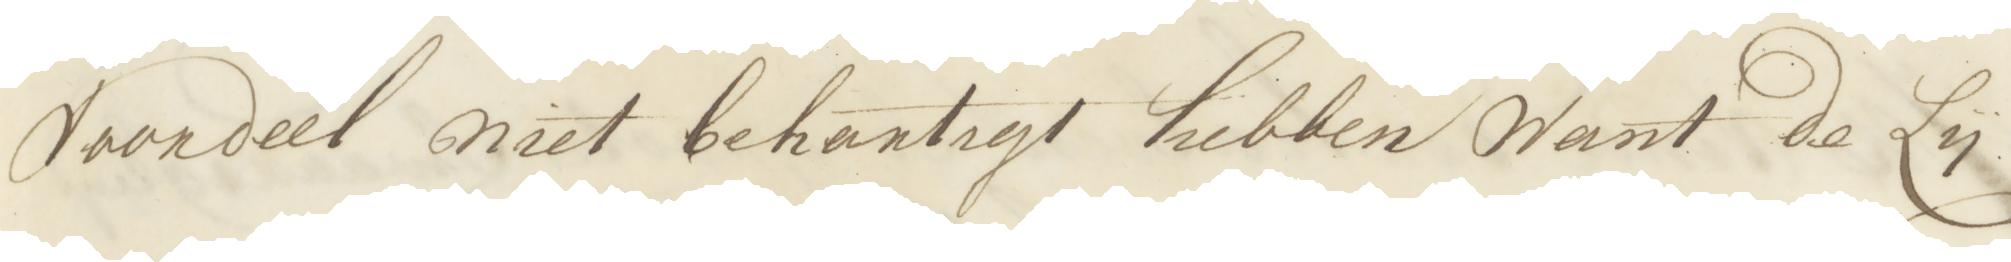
voordeel niet behartigt hebben want de Lij
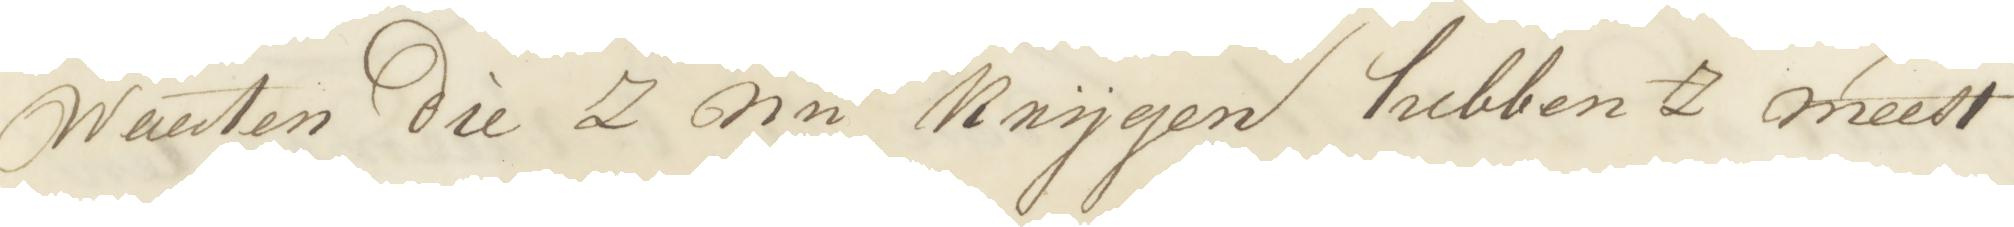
waaten die z nu krijgen hebben z meest
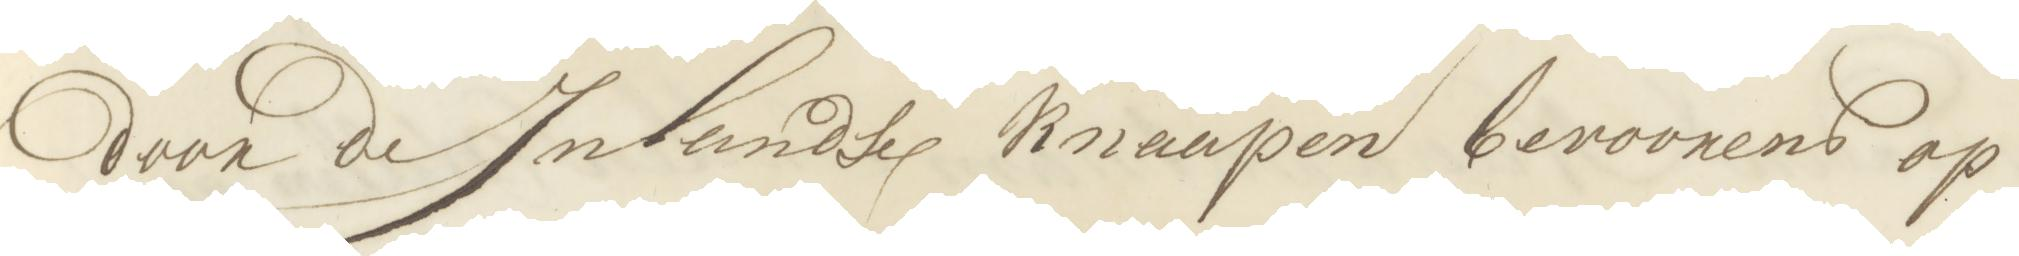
door de Jnlandse knaapen bevoorens op
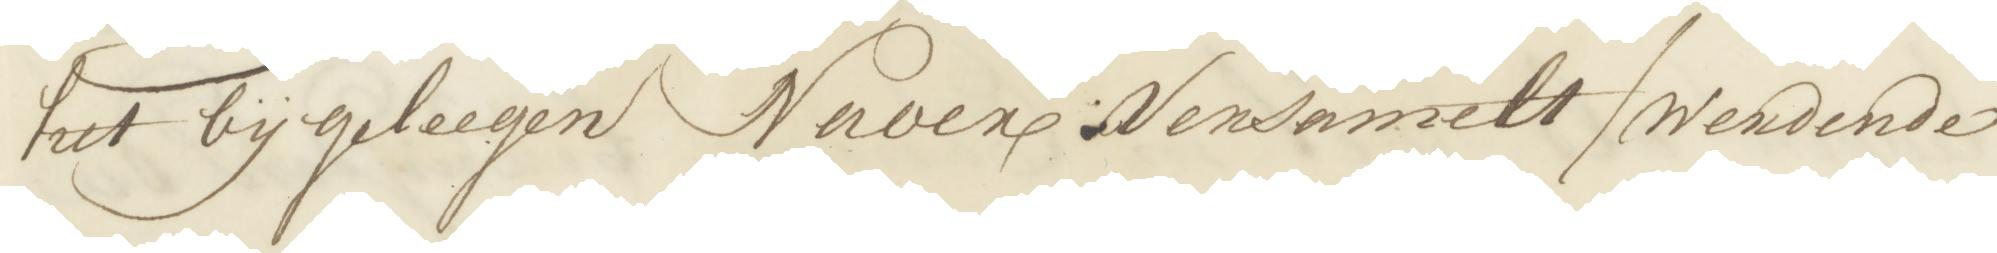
het bij geleegen Naoer versamelt / werdende
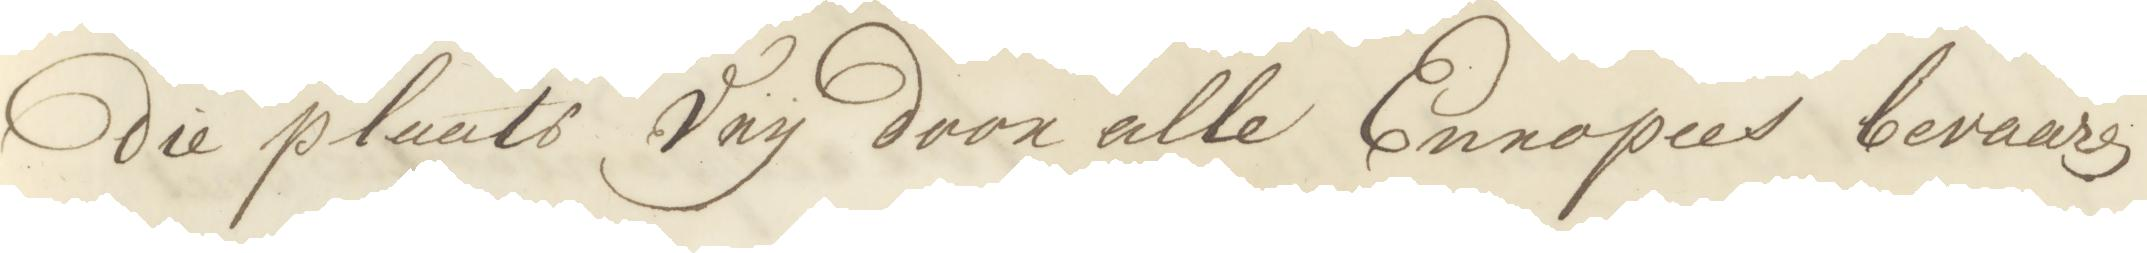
die plaats vrij door alle Europees bevaaren
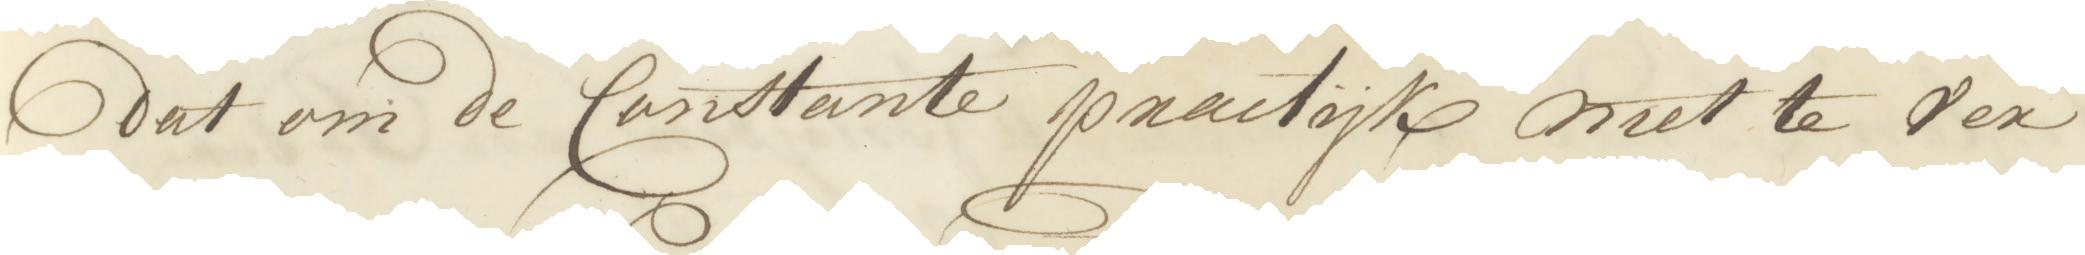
dat om de Constante practijk niet te ver
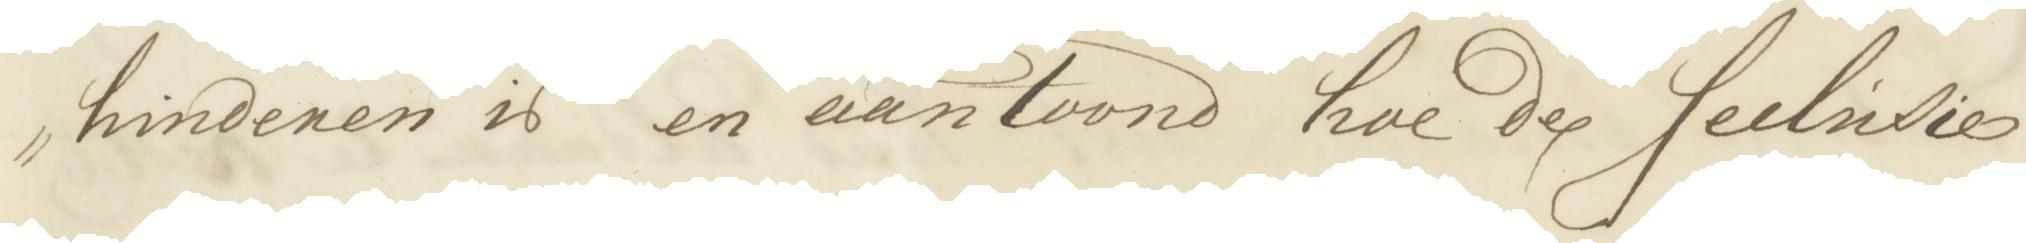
„hinderen is en aan toond hoe de seclusie
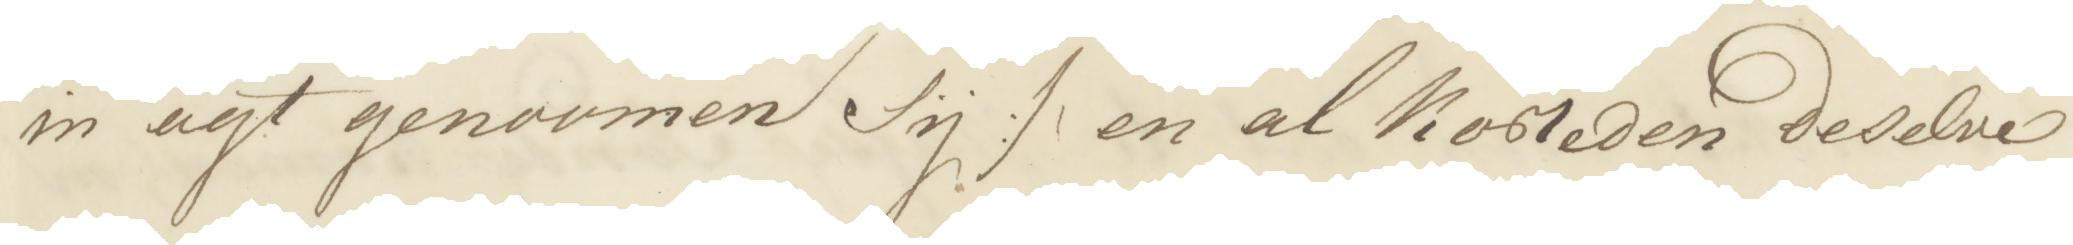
in agt genoomen sij :/ en al kosteden deselve
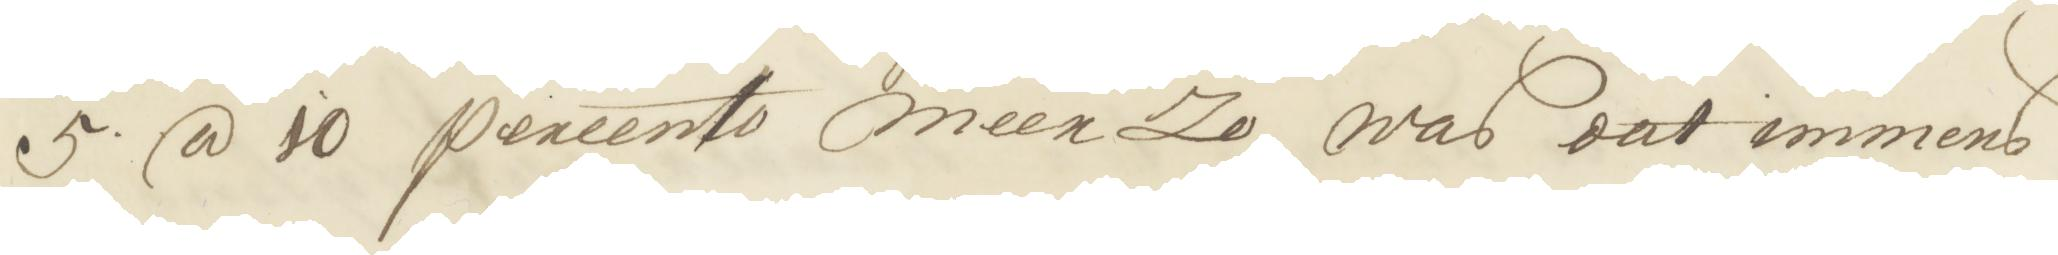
5 @ 10 percento meer zo was dat immers
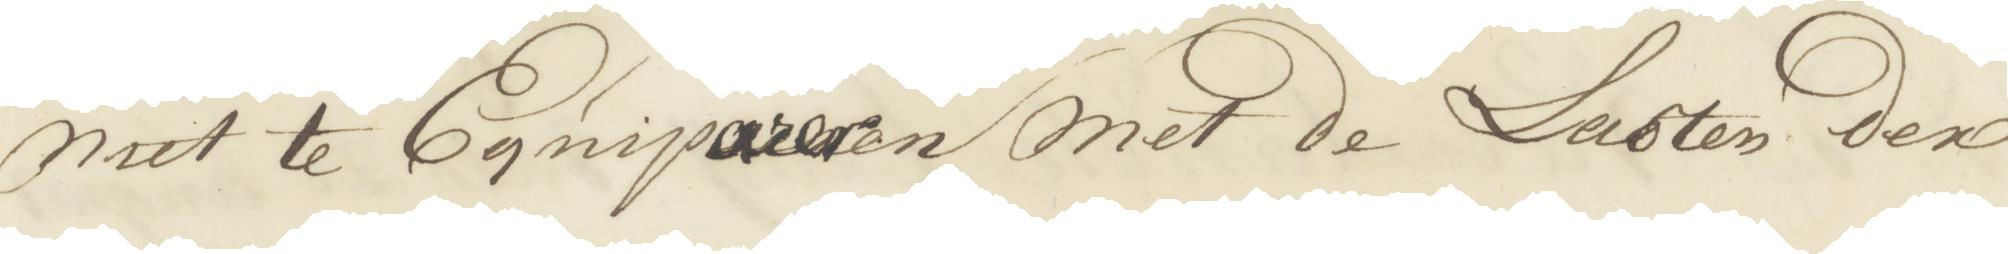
niet te Equipareren met de Lasten der
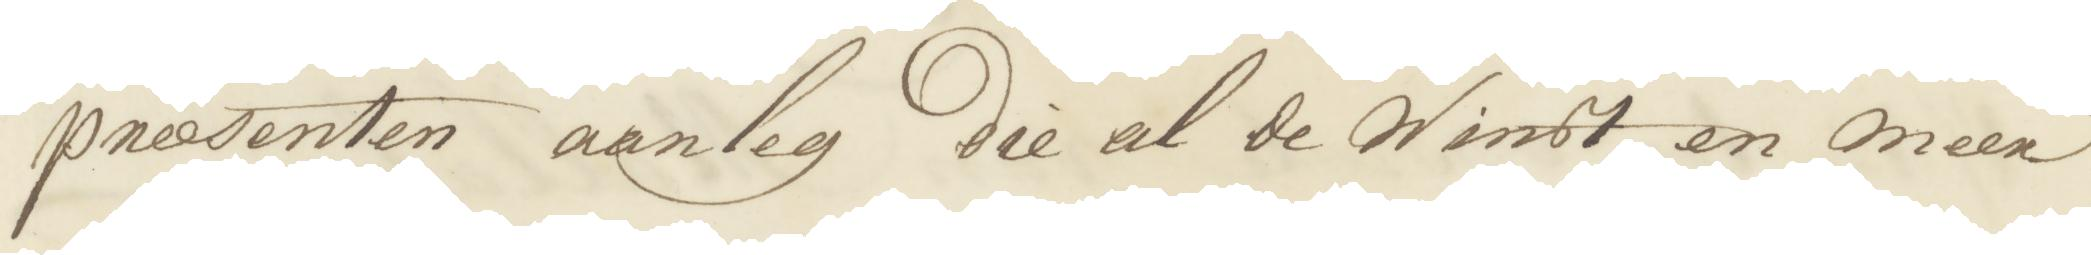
presenten aanleg die al de winst en meer
